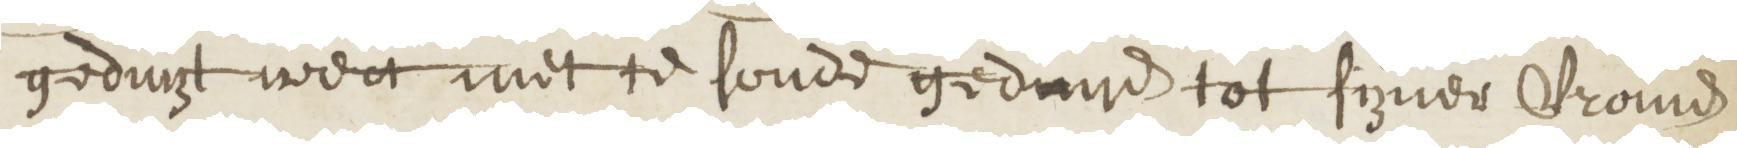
geduyt wert met te soude gedanen tot sijner Vromen
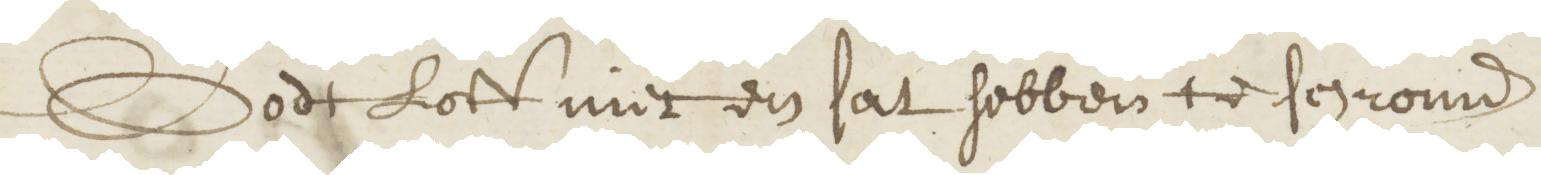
Godt loff niet en sal hebben te schromen
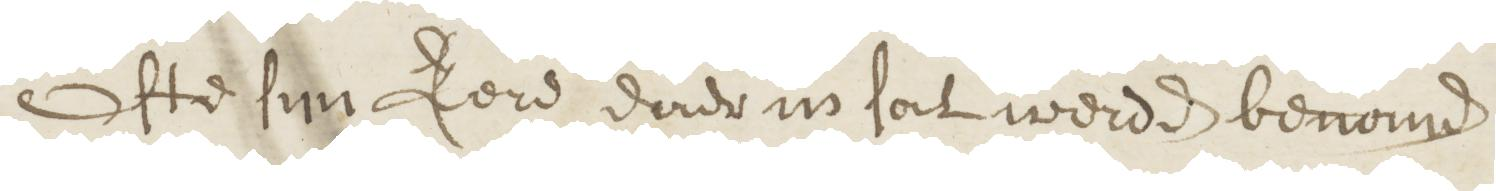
Ofte syn Zere daer in sal werden benomen
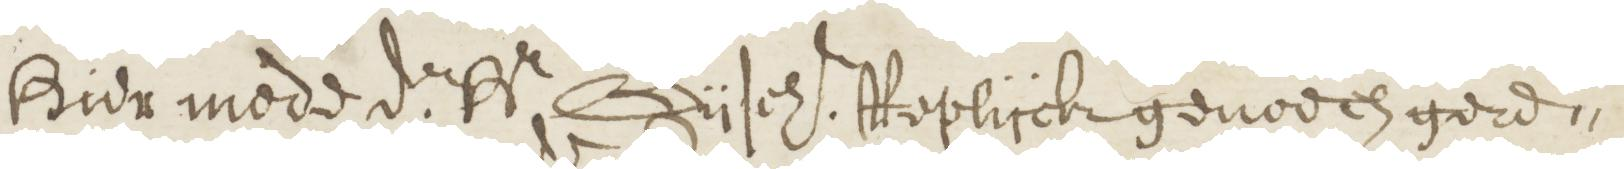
Hier mede d.r H.r Eijsch.r replijck genoech gere„
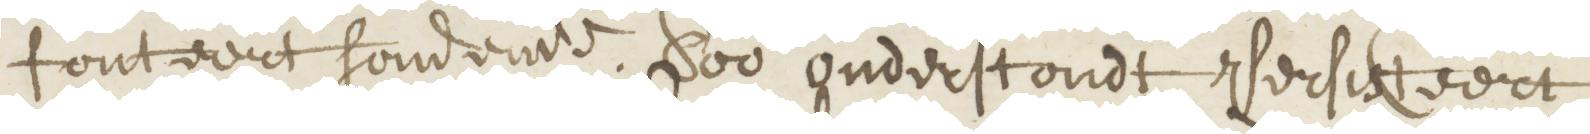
fonteert soudende. Soo onderstondt persisteert
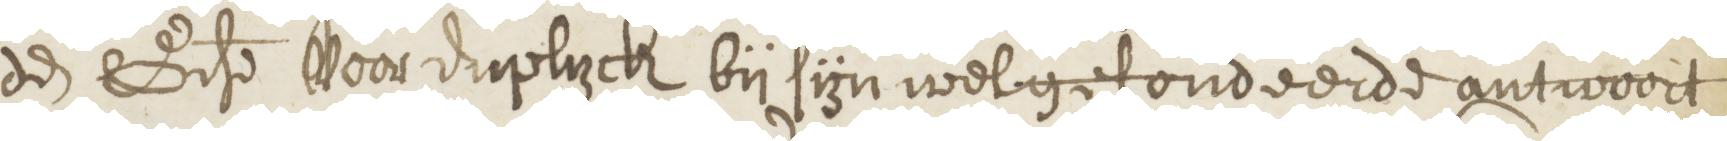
den Eise voor duplyck bij sijn welgefondeerde antwoort
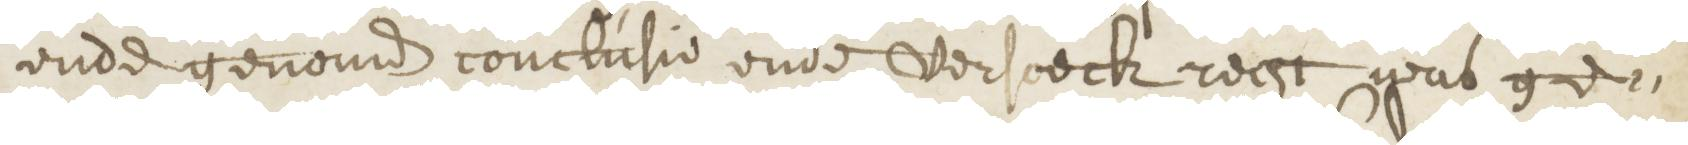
ende genomen conclusie ende versoeck regt was ge„
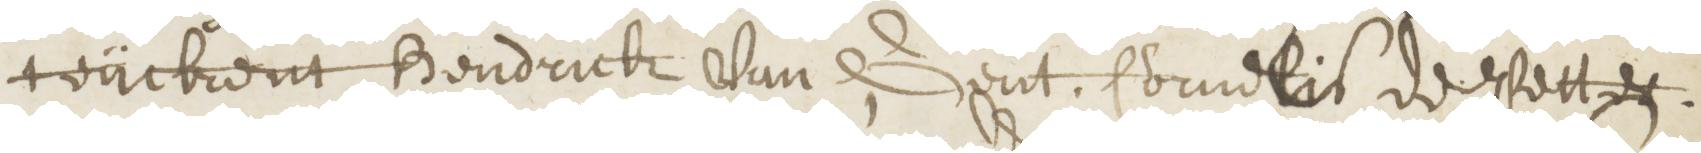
teijckent Hendrick van Gent. Cornelis de petter.
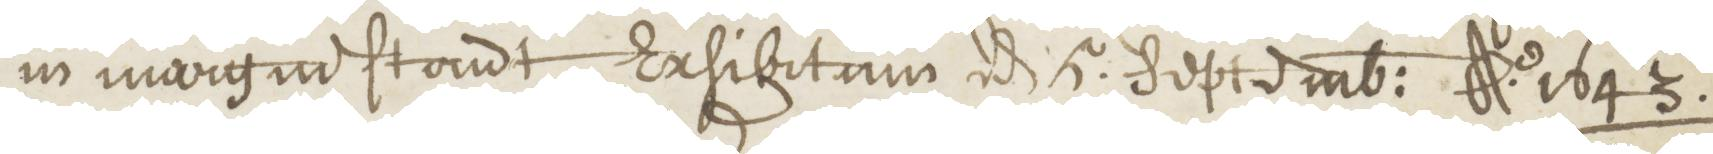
in margine stondt - Exhibitum den 5. septemb: A.o 1643.
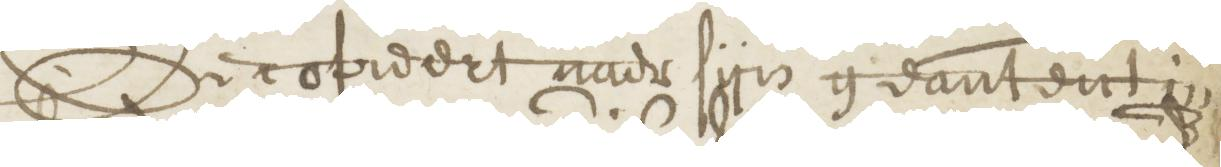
Gecopieert naer sijn geautenti„
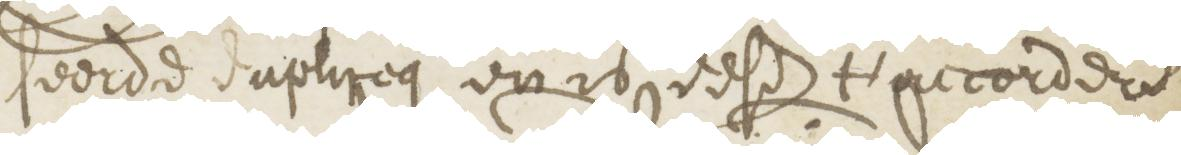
seerde duplycq en is desen t' accorderen
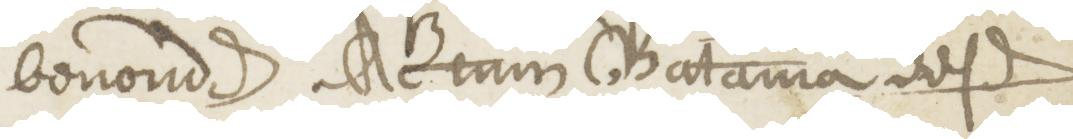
bevonden Actum Batavia desen
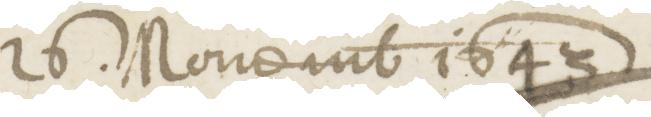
26. Novemb 1643
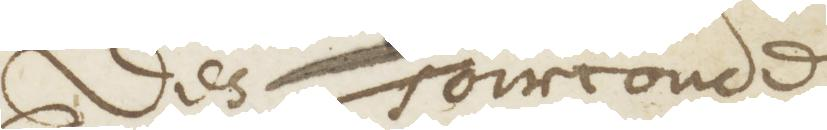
Den Toirconde
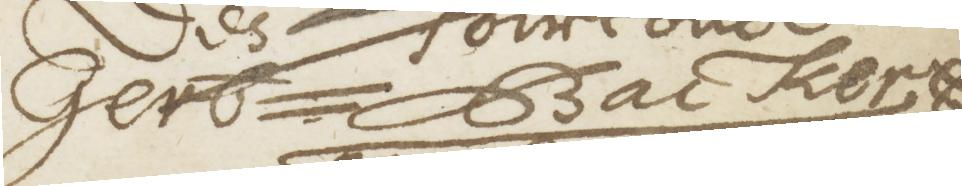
Gerb= Backer
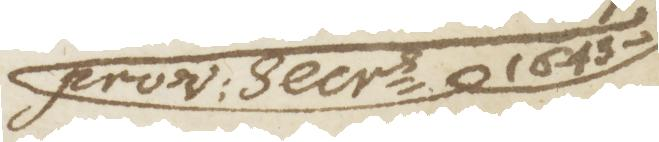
prov: secr=s 1643 —
